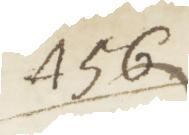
456
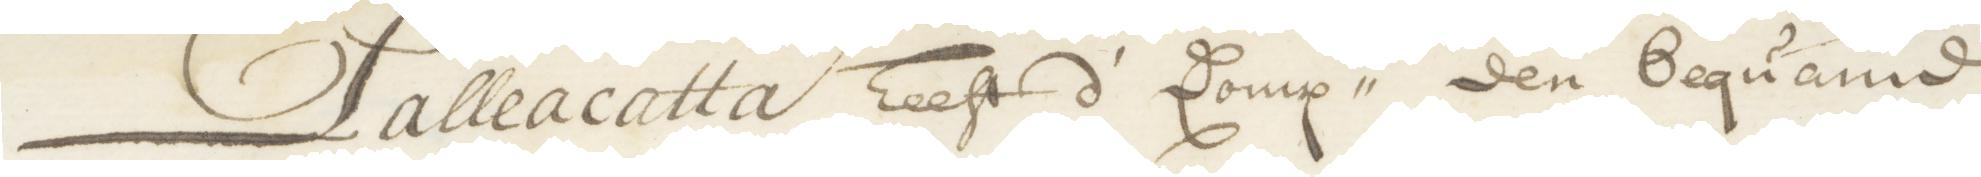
Palleacatta heeft d’ Comp„e een bequame
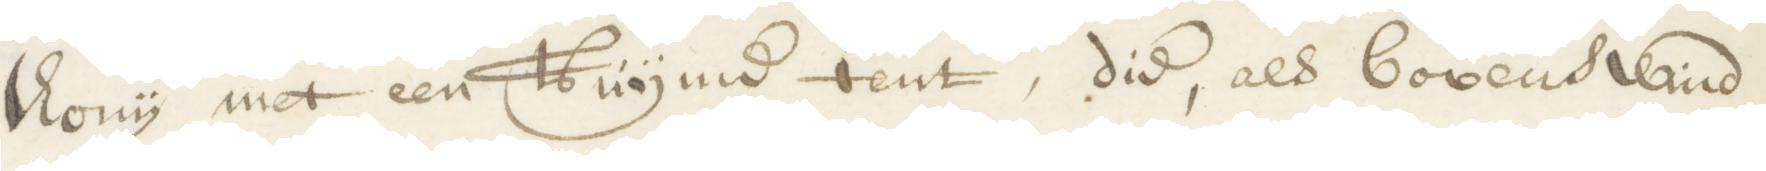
thonij met een Ruijme tent, die, als bovens wind
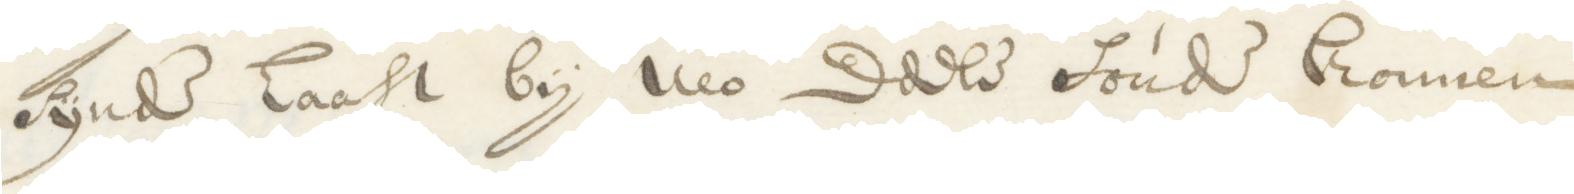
sijnde haast bij uw Edele soude konnen
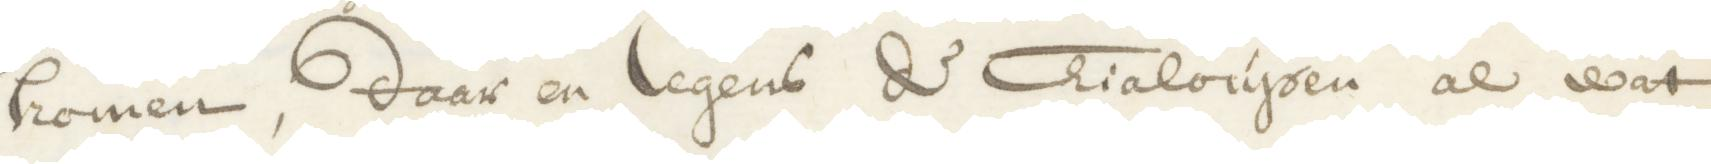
komen, daar en tegens de Chialoupen al wat
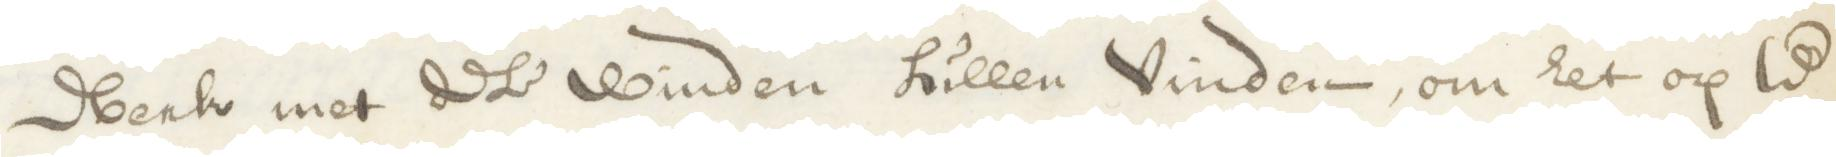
werk met dese winden sullen vinden, om het op te
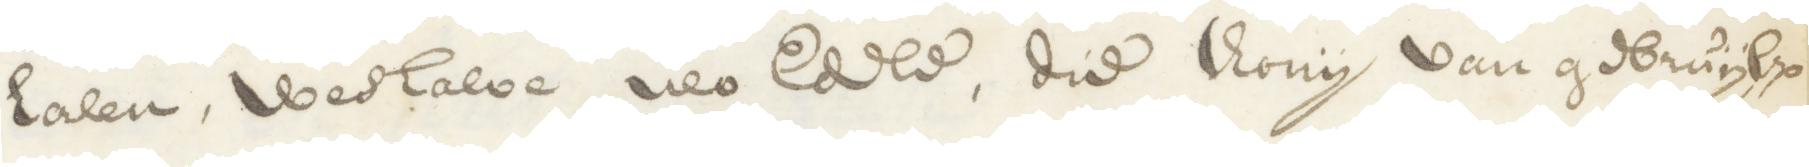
halen, weshalve uw Edele, die thonij van gebruijk
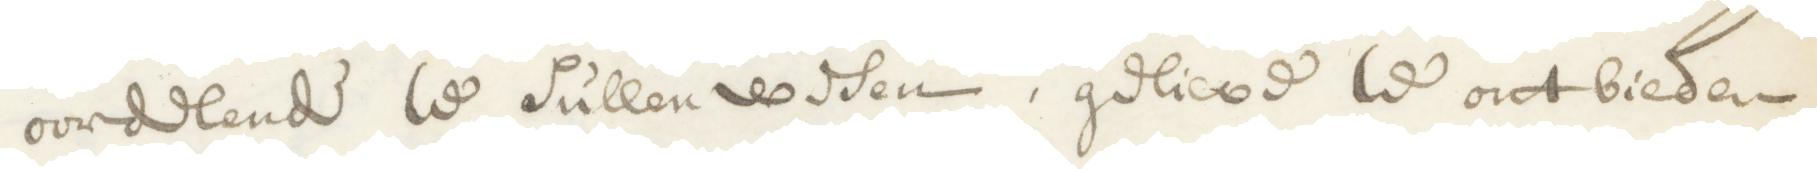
oordelende te sullen wesen, gelieve te ontbieden
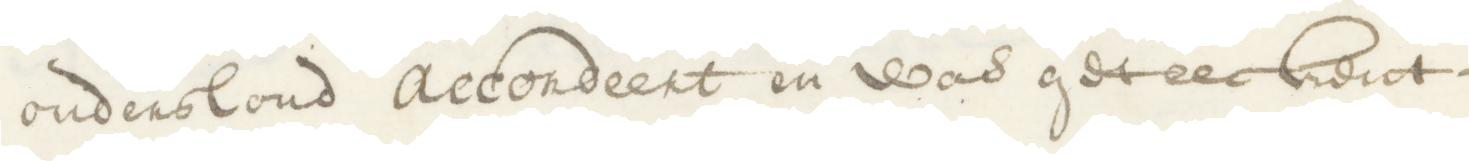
onderstond accordeert en was geteeckent
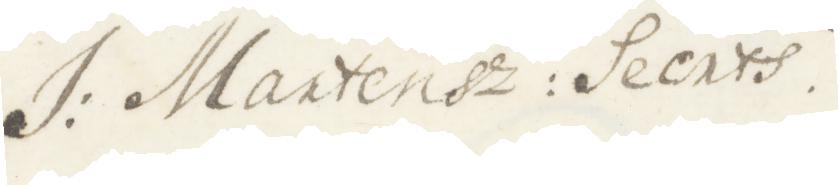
J: Martensz: Secrts.
